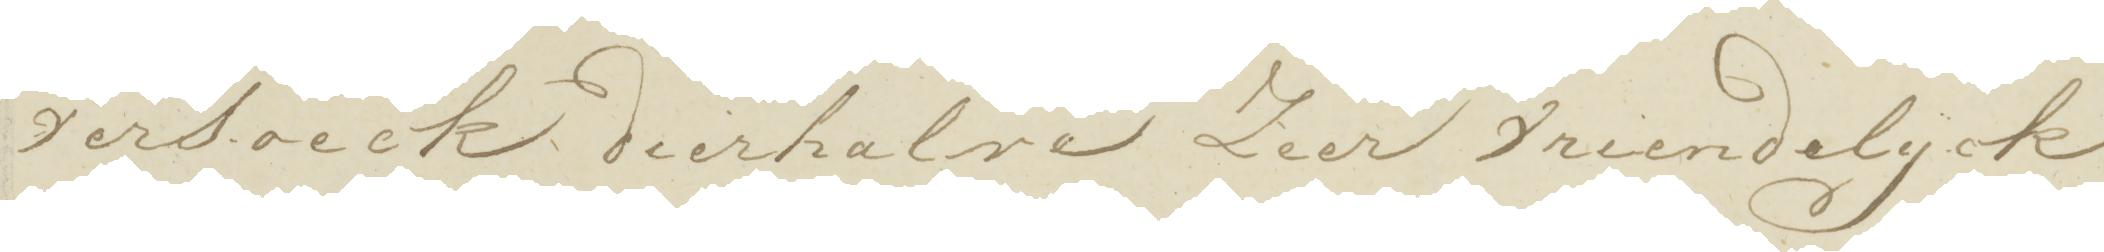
versoeck dierhalve zeer vriendelijck
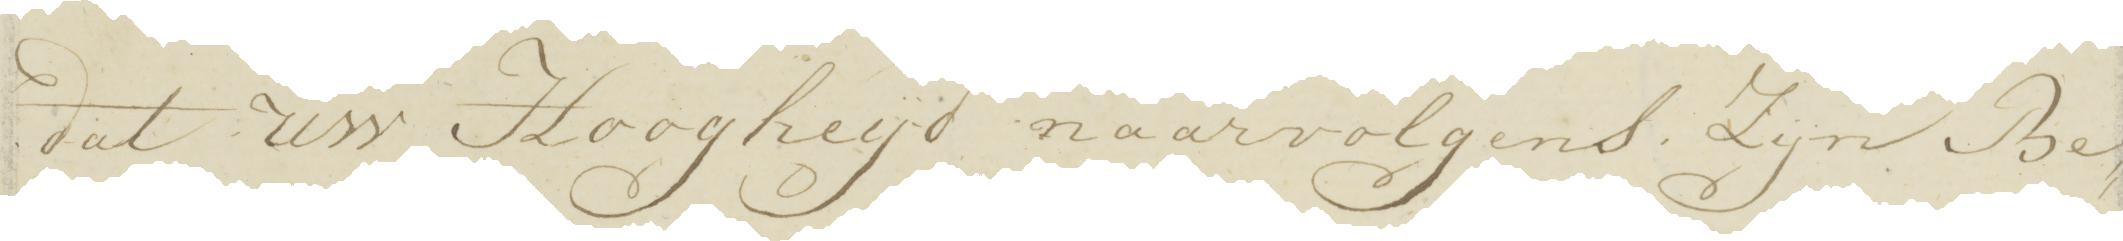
dat uw Hoogheijd naarvolgens zijn Be
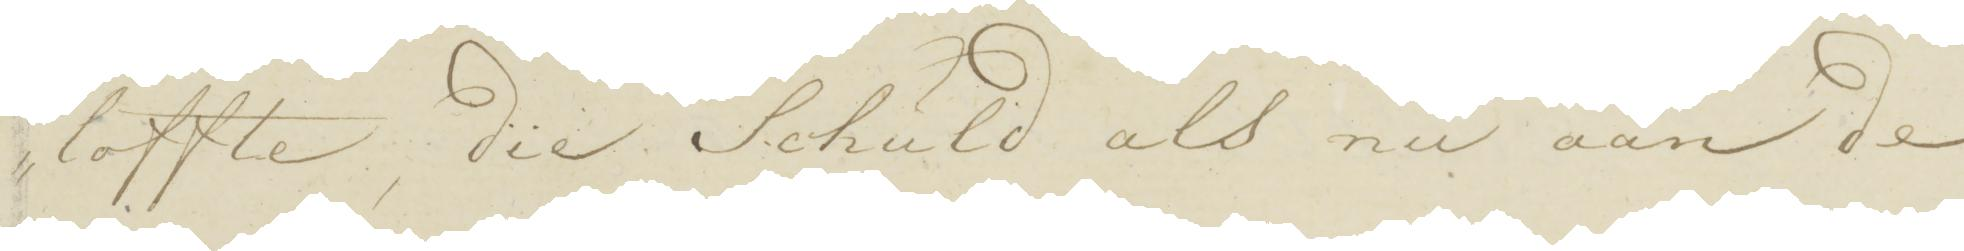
„loffte, die schuld als nu aan de
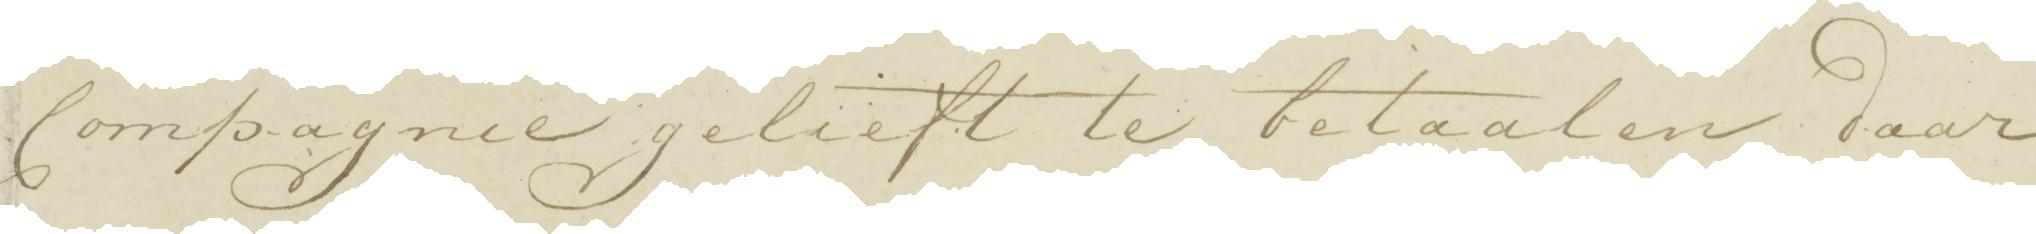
Compagnie gelieft te betaalen daar
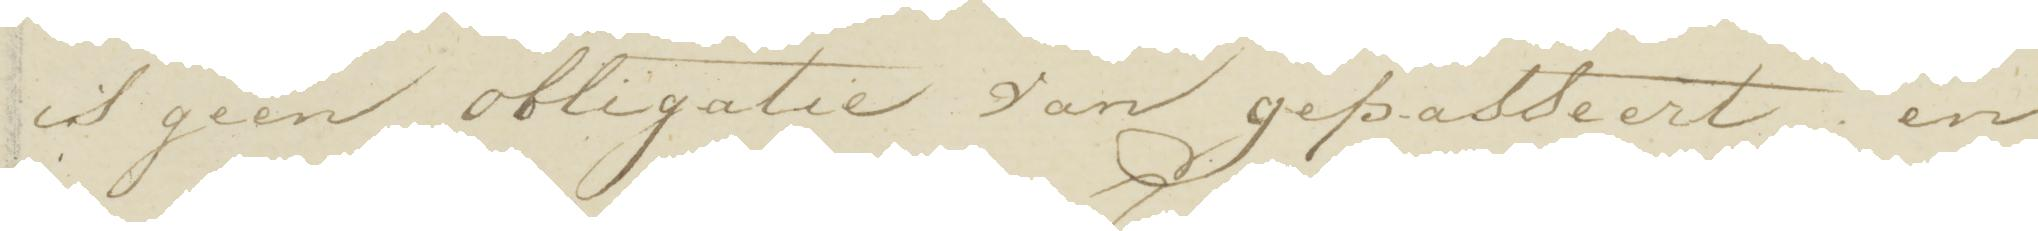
is geen obligatie van gepasseert, en
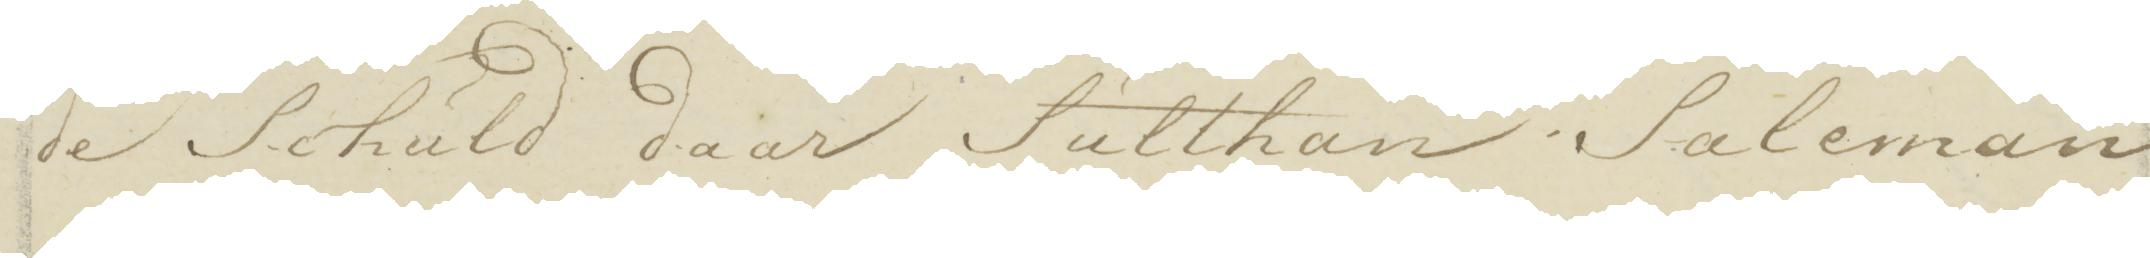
de schuld daar sulthan Saleman
